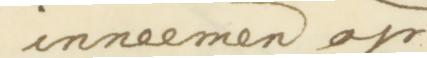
inneemen op
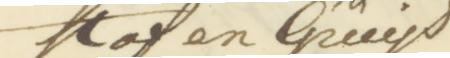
stof en Gruijs
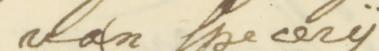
van specerij
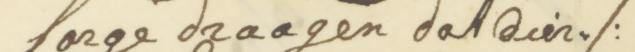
sorge draagen dat dier /:
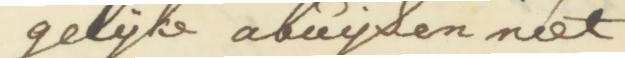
gelijke abuijsen niet
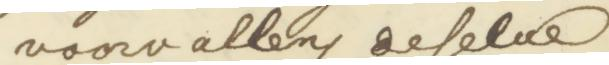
voorvallen, deselve
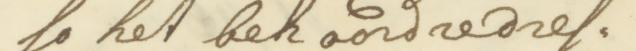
so het behoord redres„
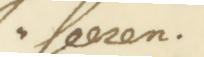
„seeren.
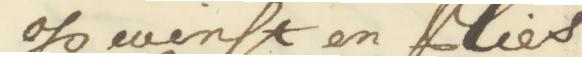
op winst en verlies
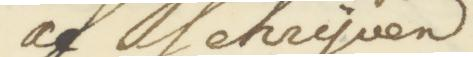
af schrijven
